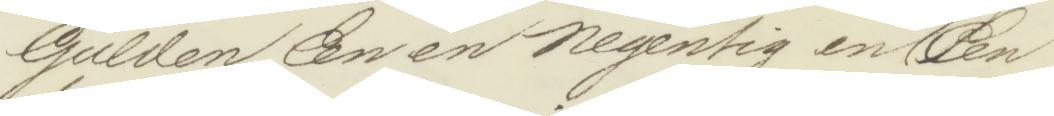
Gulden Een en negentig en Een
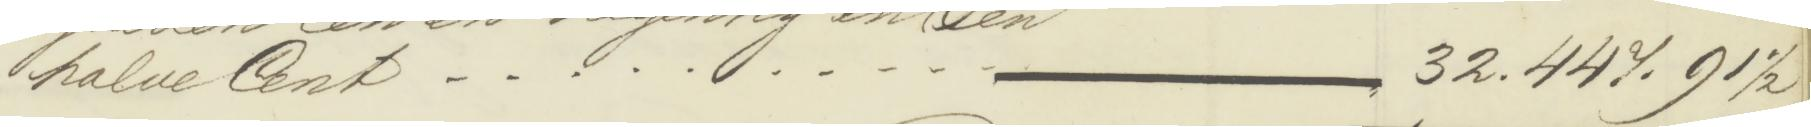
halve Cent - - - - - - - - - - - - - — 32.447. 91½
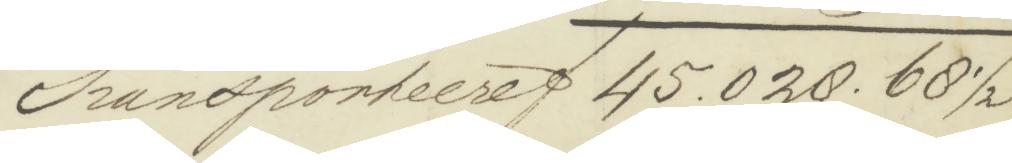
Transporteere ƒ 45.028.68½
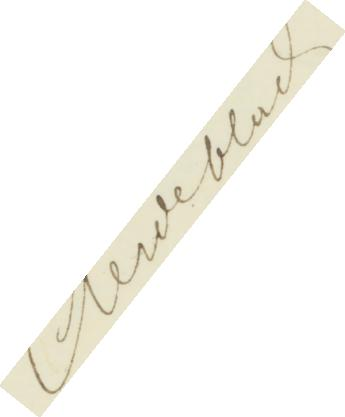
Derdeblad
